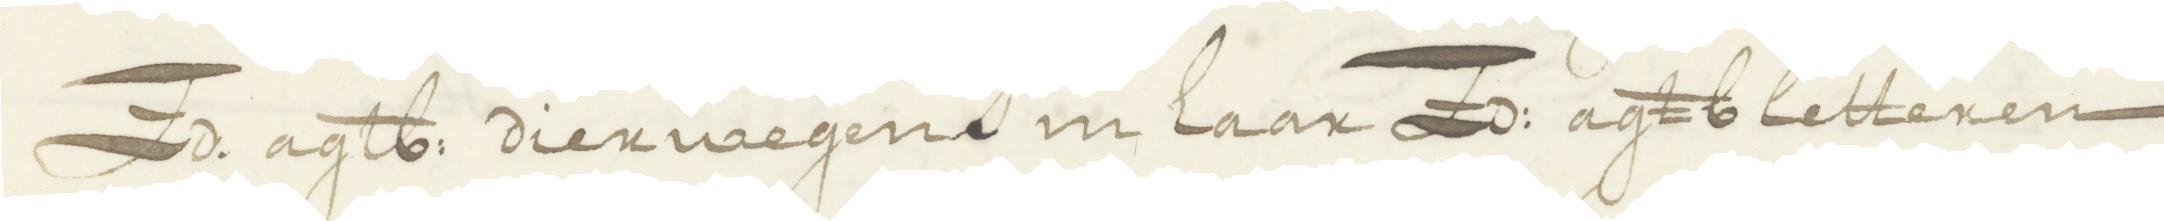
Ed: agtb: dier wegens in haar Ed: agtb letteren
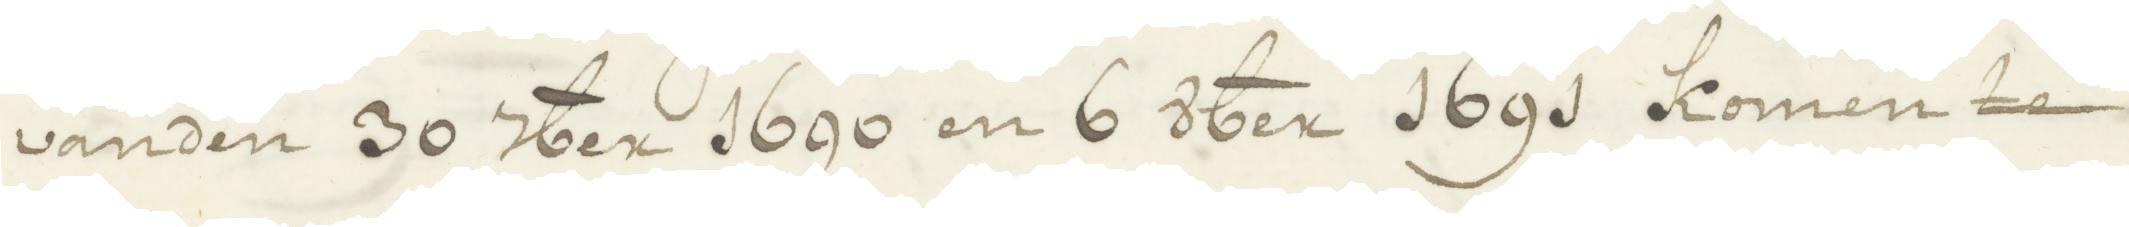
van den 30 7ber 1690 en 6 8ber 1691 komen te
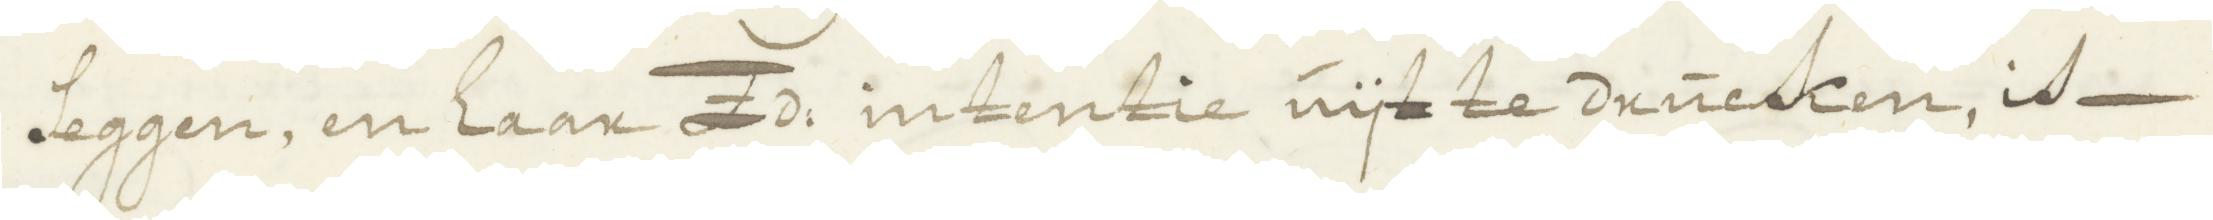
seggen, en haar Ed: intentie uijt te drucken, is —
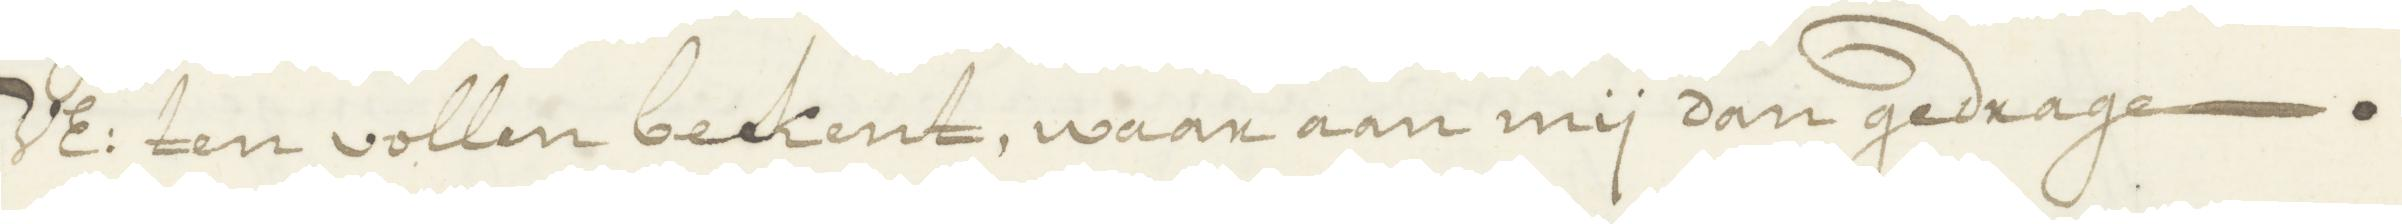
VE: ten vollen bekent, waar aan mij dan gedrage.
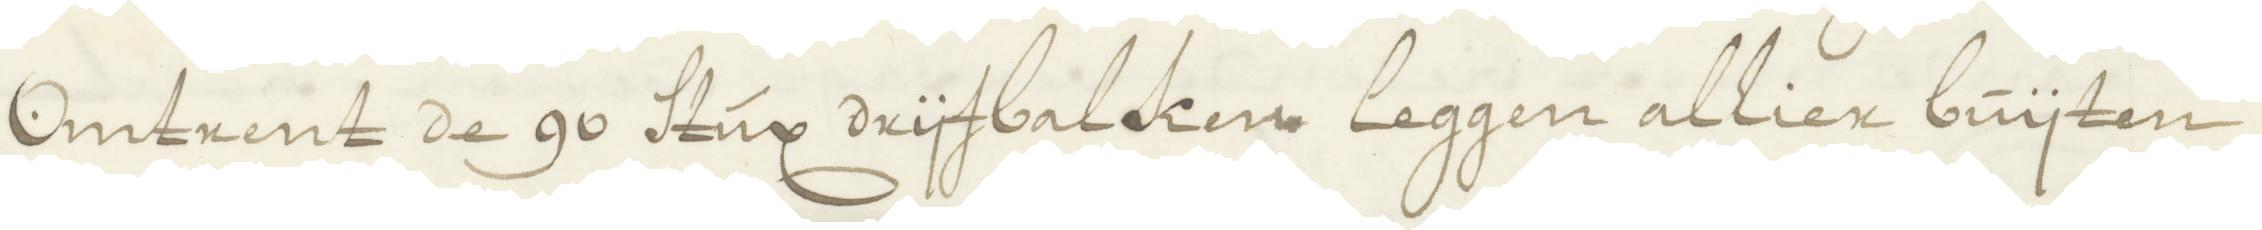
Omtrent de 90 stux drijfbalken leggen alhier buijten
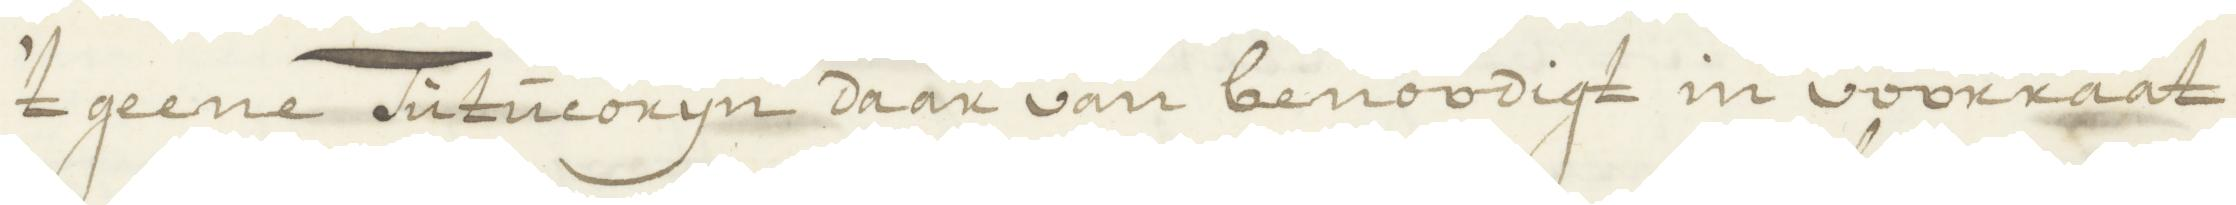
’t geene Tutucorijn daar van benoodigt in voorraat
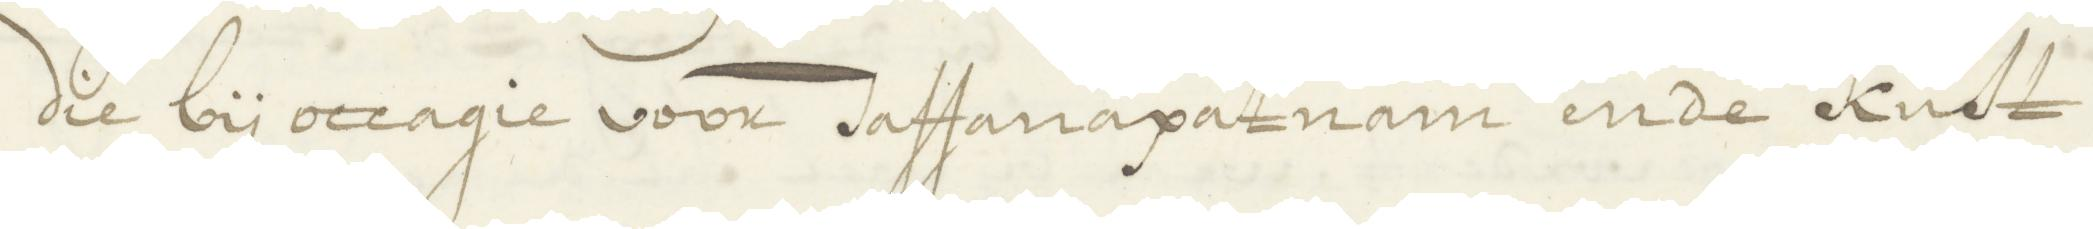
die bij occagie voor Jaffanapatnam en de kust
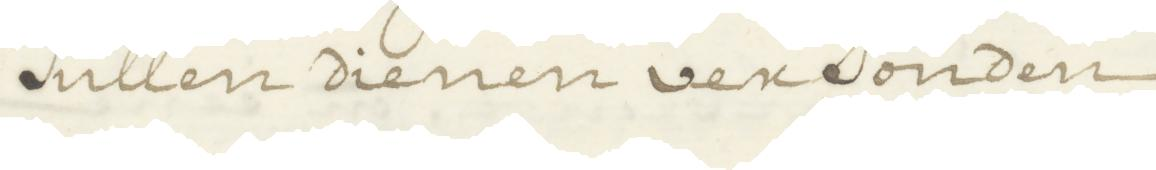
sullen dienen versonden
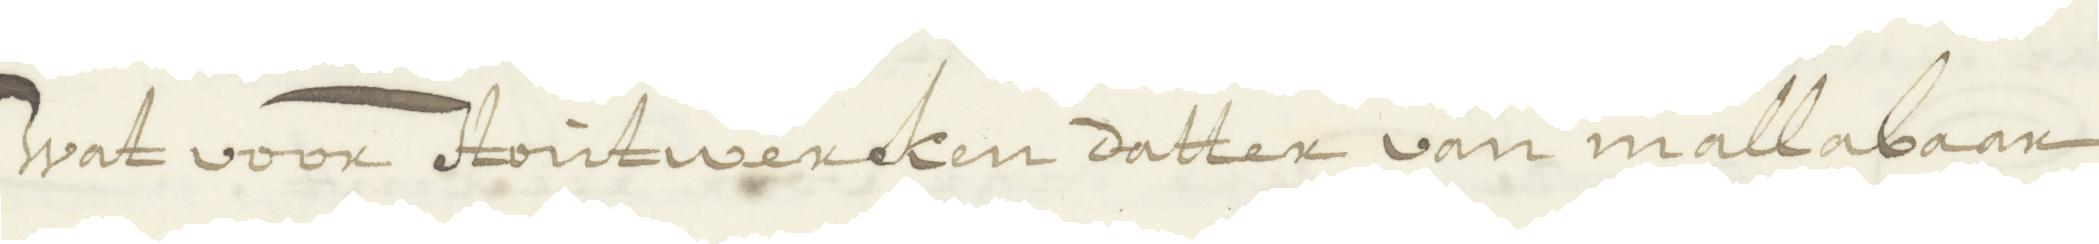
Wat voor Houtwercken datter van mallabaar
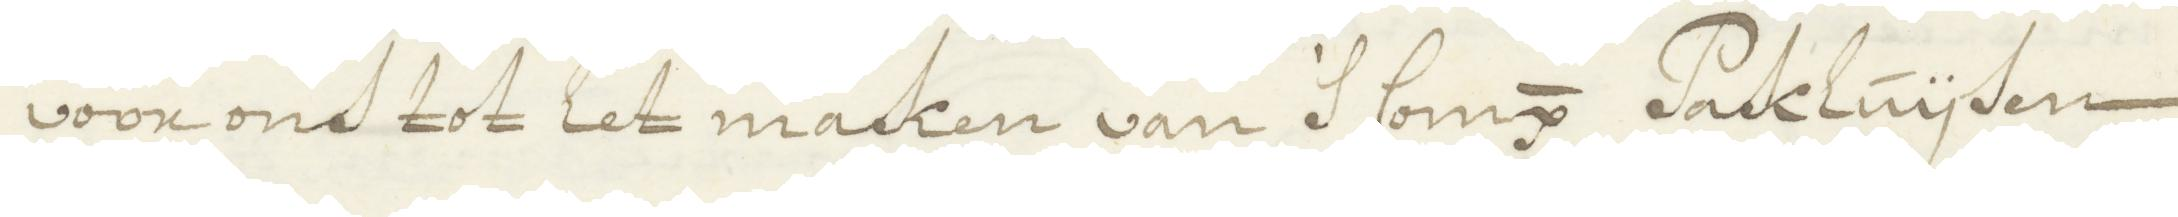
voor ons tot het maken van ’s Comp Pakhuijsen
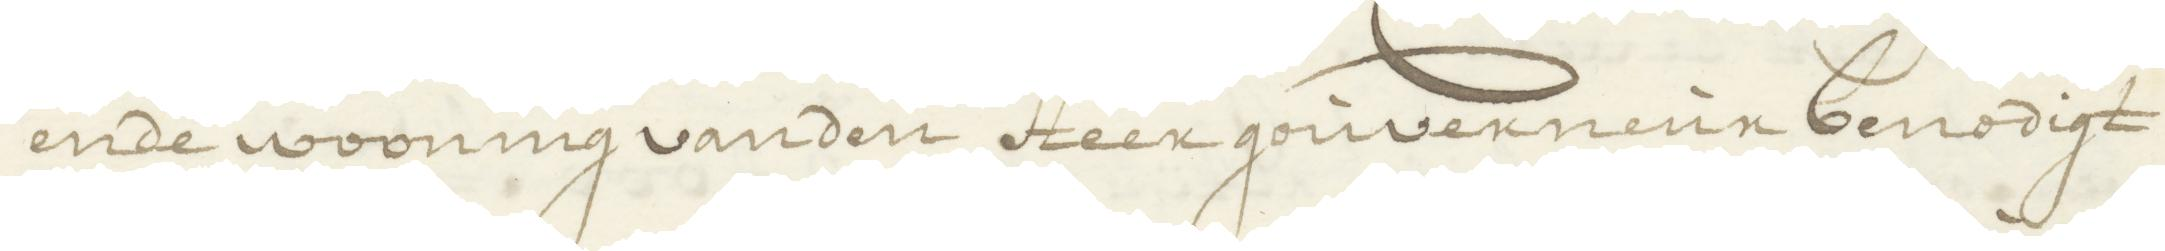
en de wooning van den Heer gouverneur benodigt
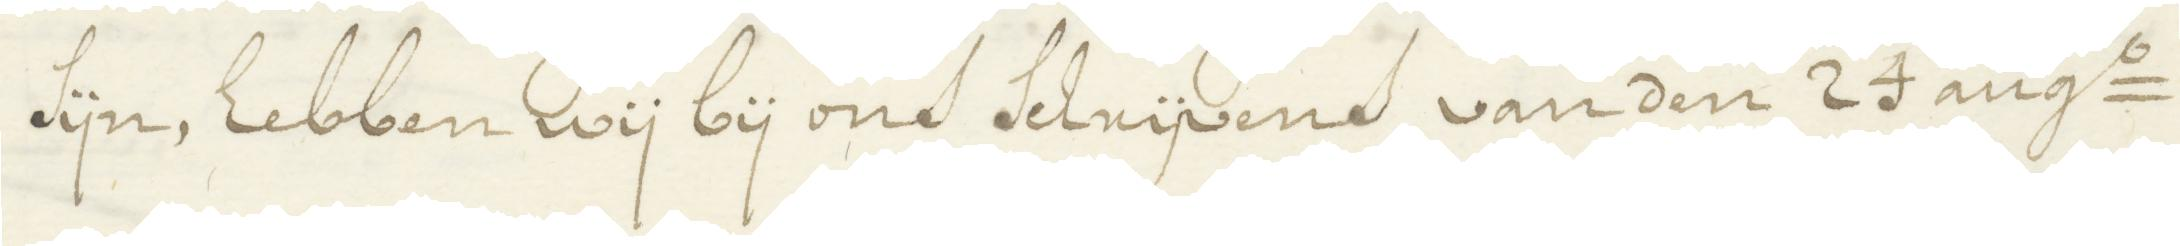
sijn, hebben wij bij ons schrijvens van den 24 aug=o
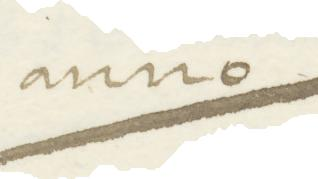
anno
